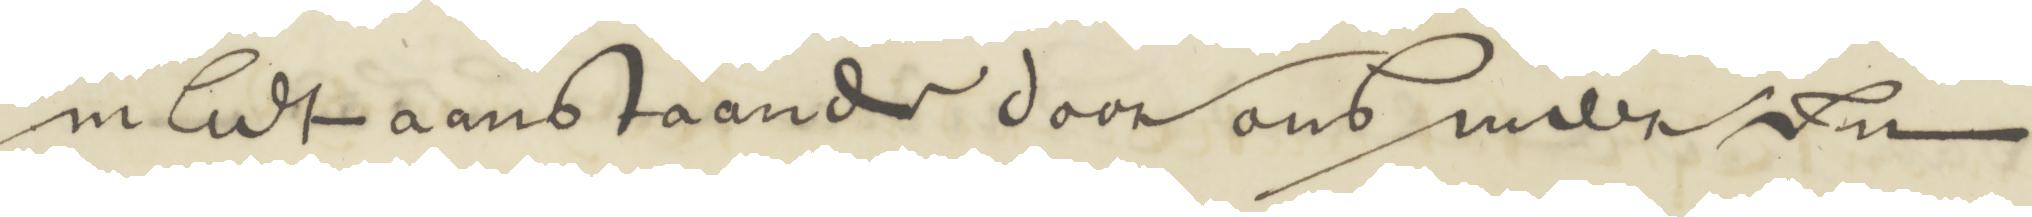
in het aanstaande door ons meer En
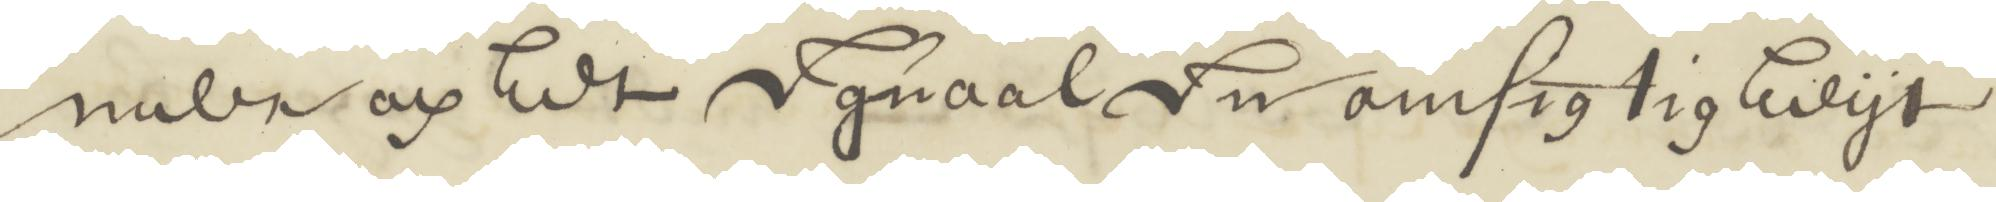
meer op het Equaal En omsigtigheijt
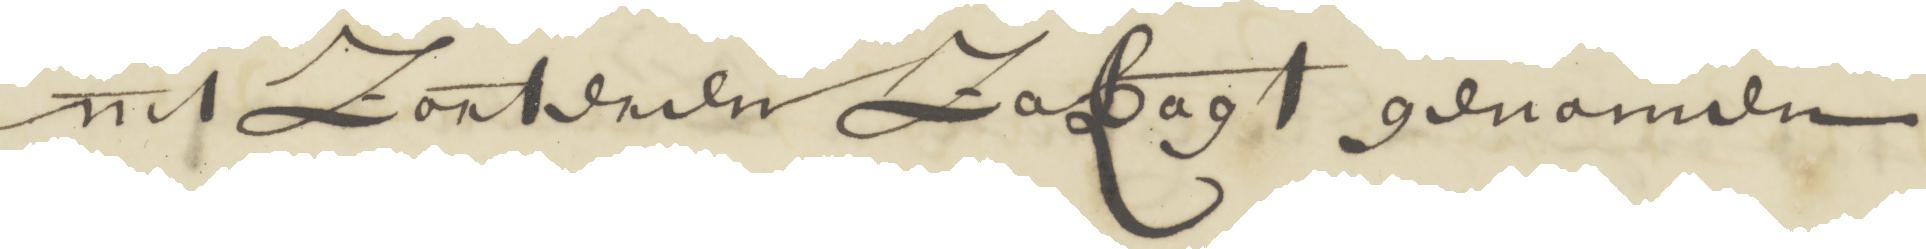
in't Zorteren Zalagt genomen
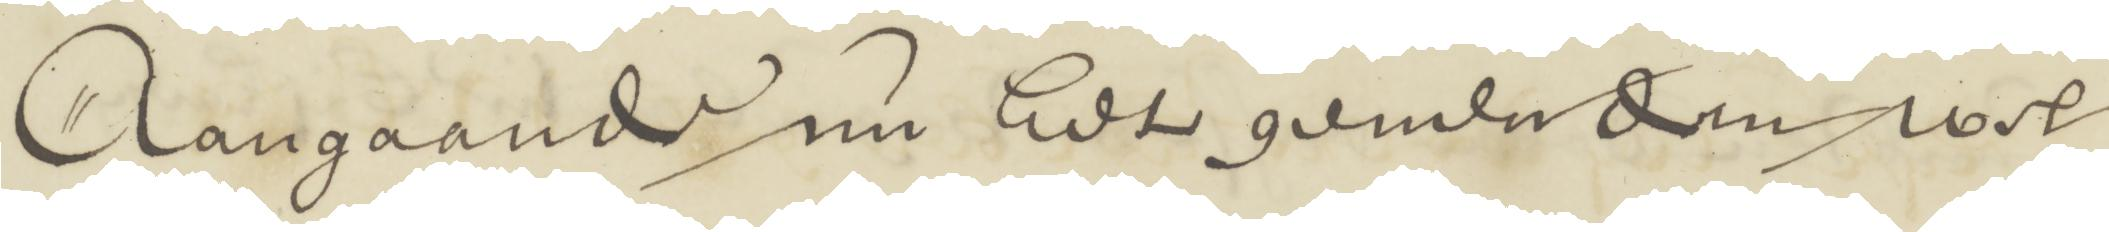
Aangaande nu het genen den wel
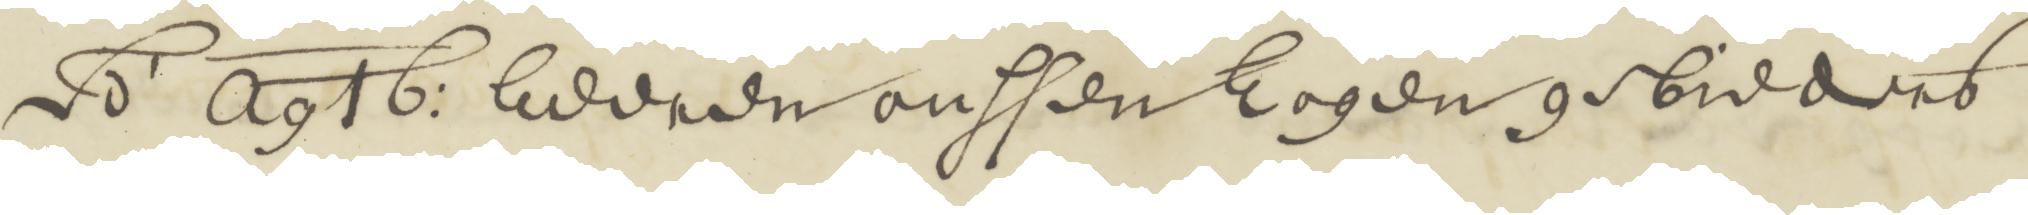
Ed' Agtb: heeren onssen hogen gebieders
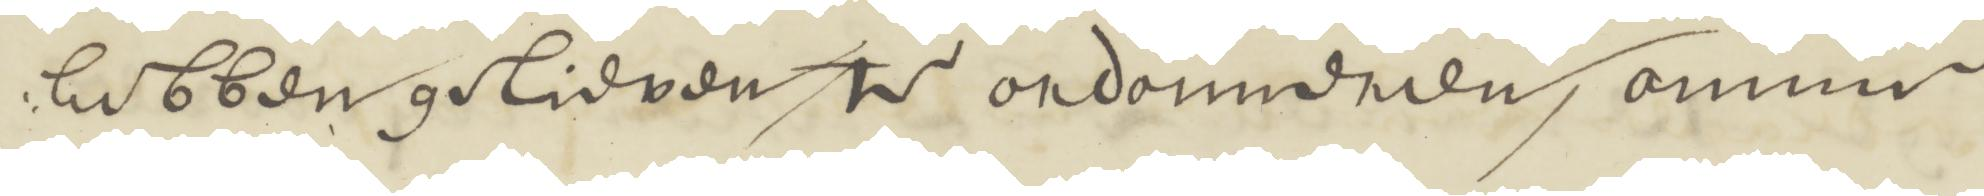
:hebben gelieven te ordonneren, omme
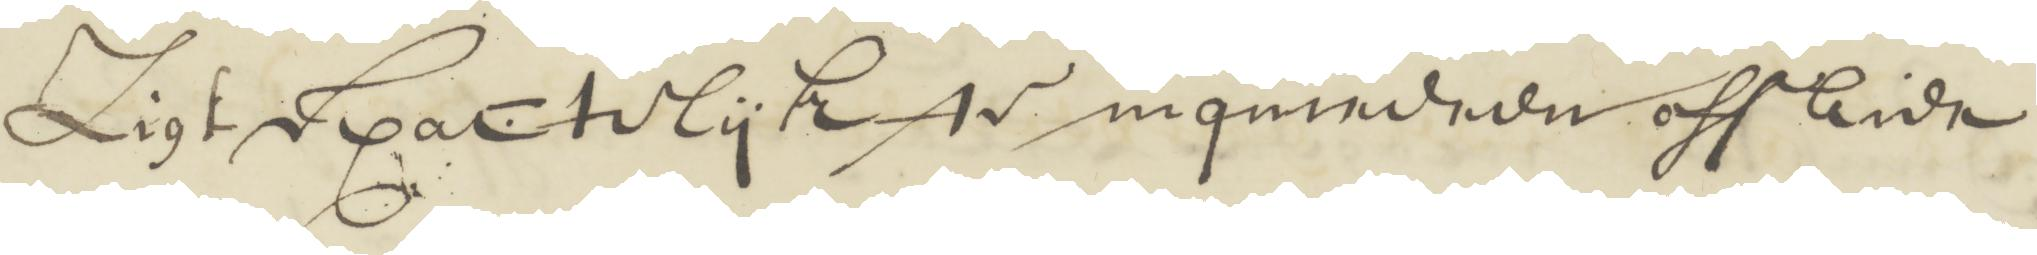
Zigt Exactelijk te inquireren off hier
